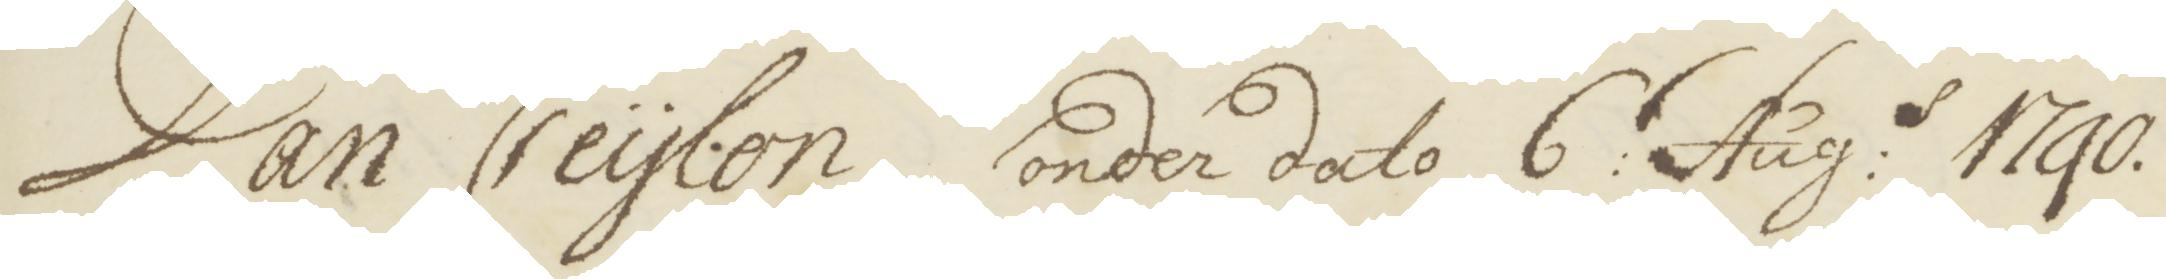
Van Ceijlon onder dato 6:' Aug:s 1740.
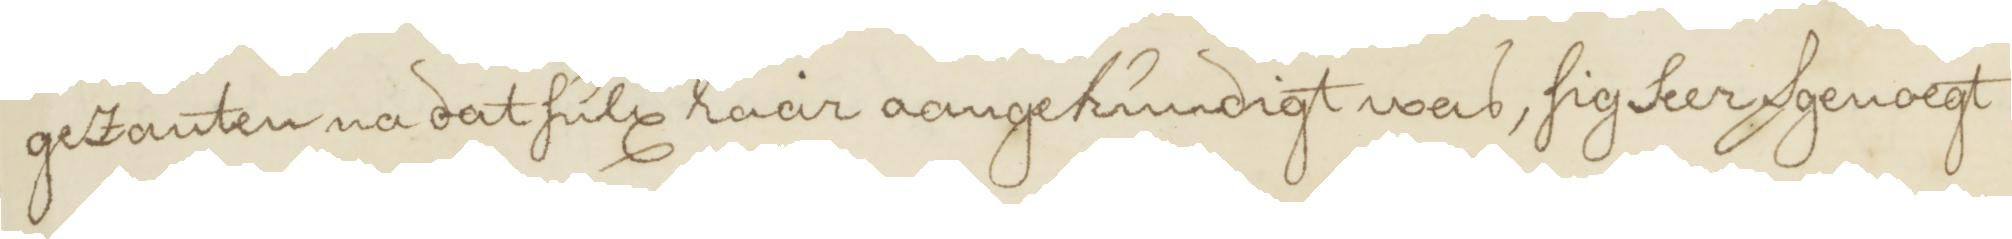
gezanten na dat sulx haar aangekundigt was, sig seer vergenoegt
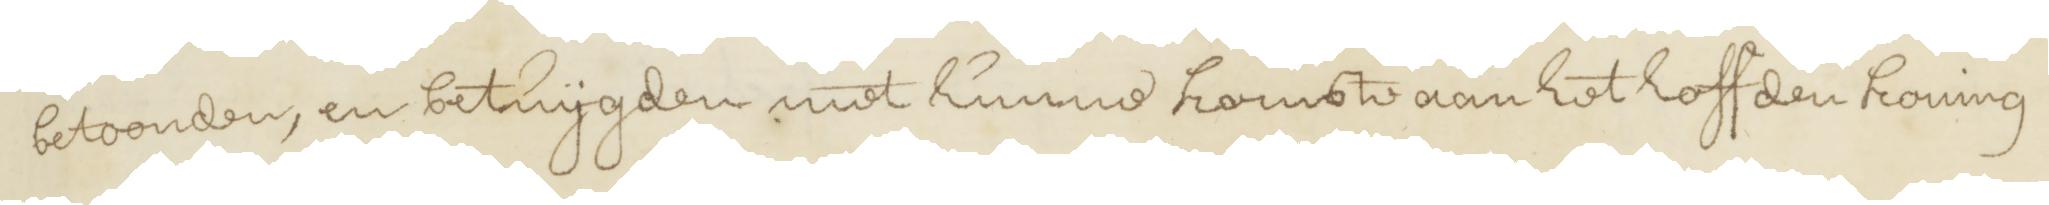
betoonden, en betuijgden met hunne komste aan het hoff den koning
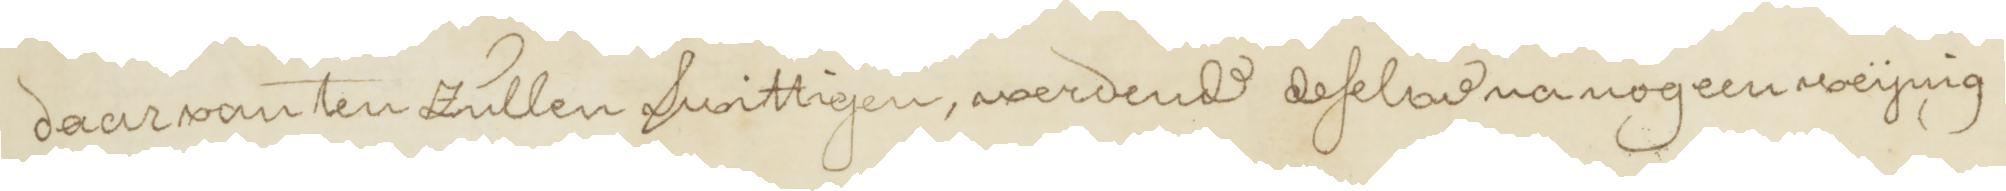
daar van ten zullen verwittigen, werdende deselve na nog een weijnig
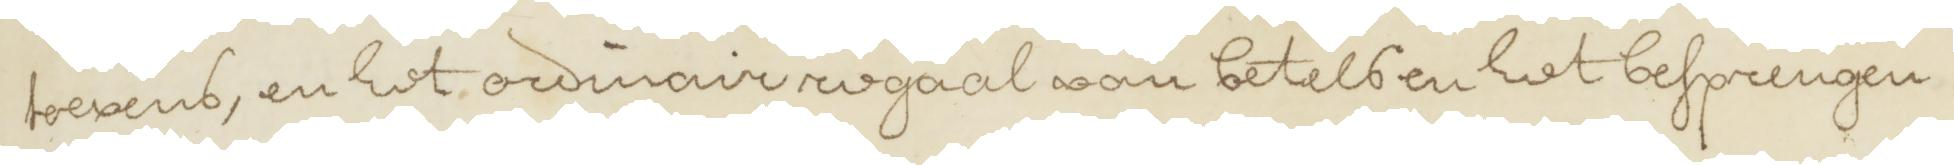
toevens, en het ordinair regaal van betels en het besprengen
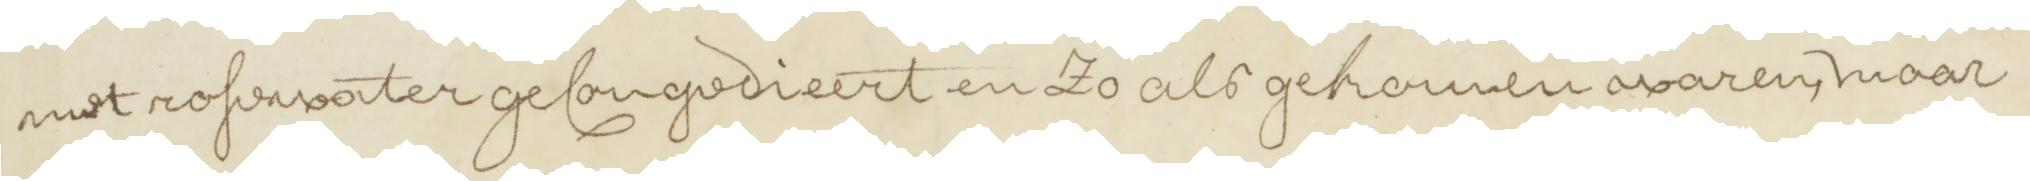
met rosewater gecongedieert en zo als gekomen waren, maar
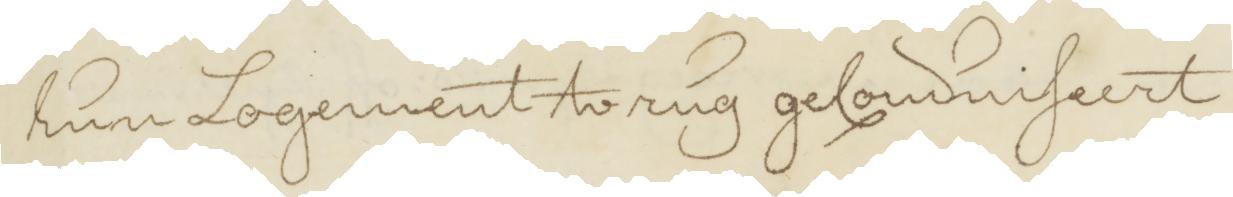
hun Logement te rug geconduiseert
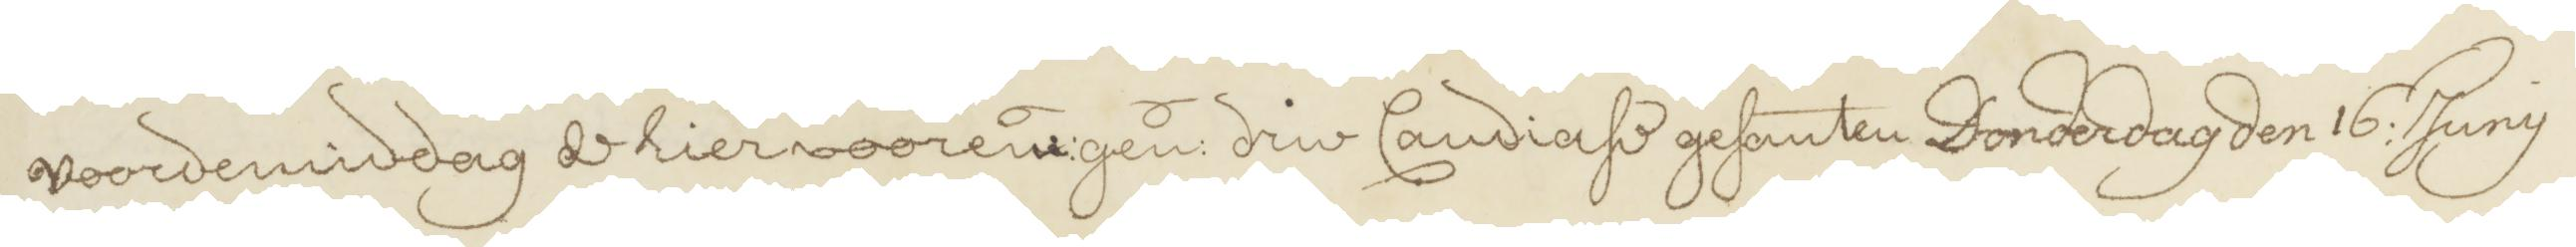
voordemiddag de hier vooren: gen: drie Candiase gesanten Donderdag den 16:' Junij
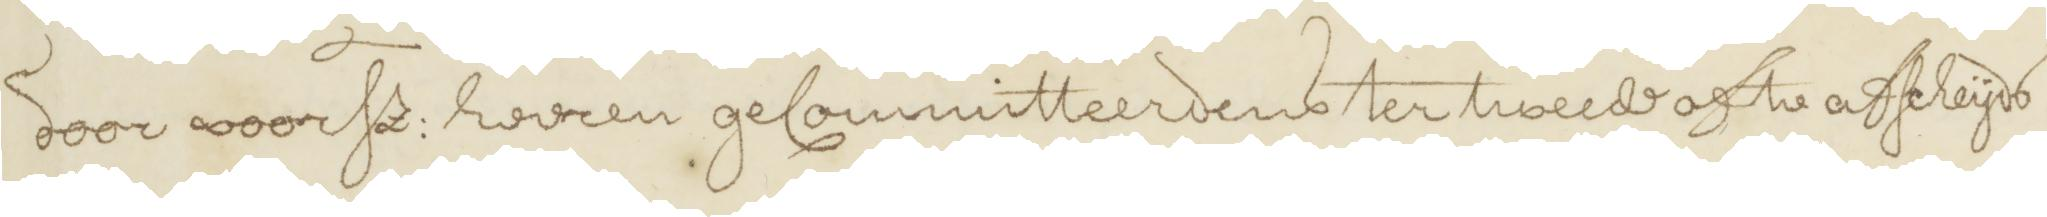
door voorsz: heeren gecommitteerdens ter tweede ofte afscheijds
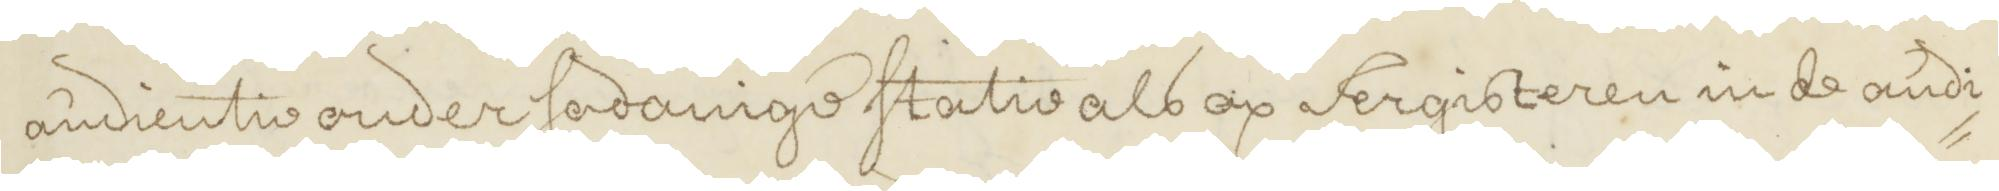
audientie onder sodanige statie als op Eergisteren in de audi„
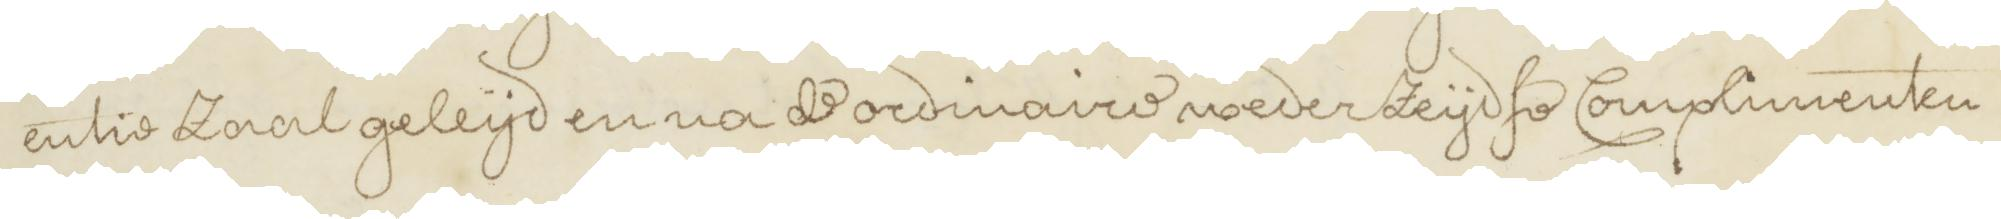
entie zaal geleijd en na de ordinaire wederzeijdse Complimenten
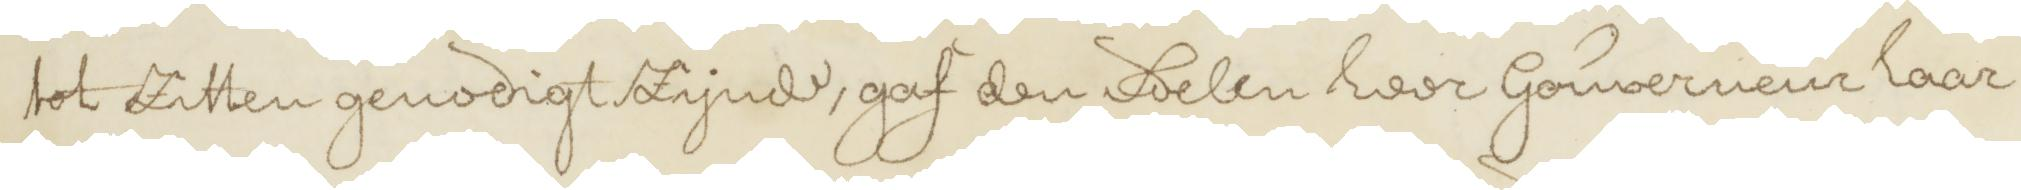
tot zitten genodigt zijnde, gaf den Edelen heer Gouverneur haar
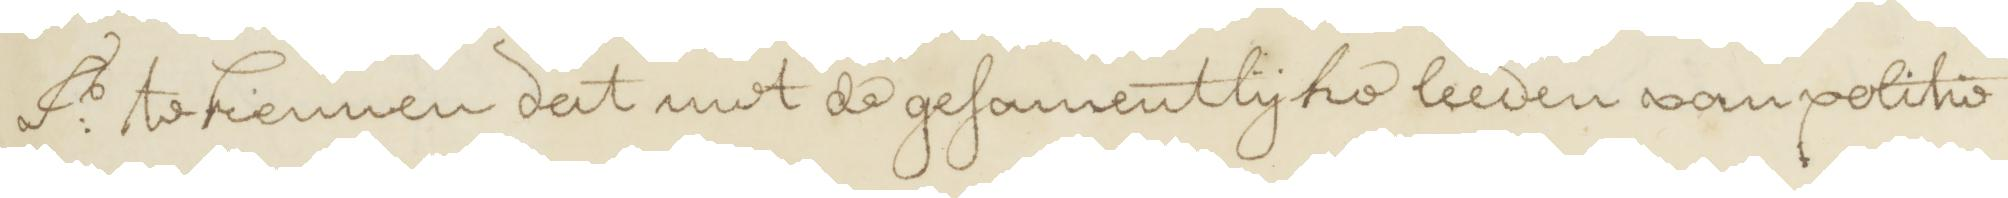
E:s te kennen dat met de gesamentlijke leeden van politie
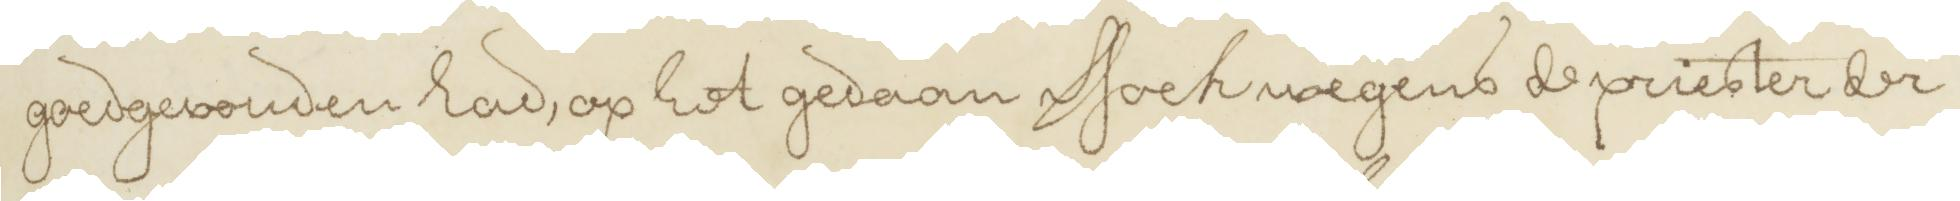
goedgevonden had, op het gedaan versoek wegens de priester der
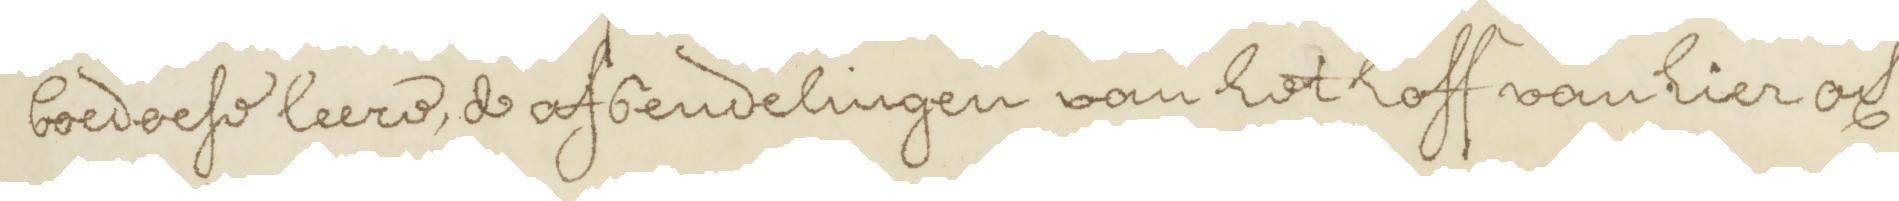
boedoese leere, de afsendelingen van het hoff van hier over
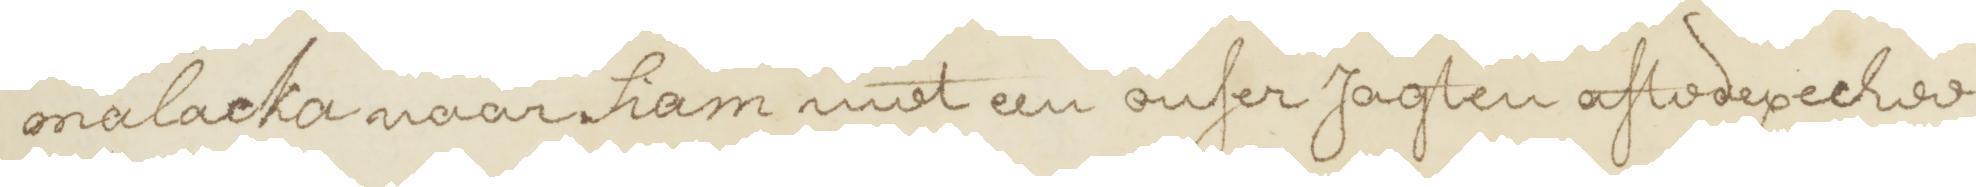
malacka naar siam met een onser Jagten afte depechee„
